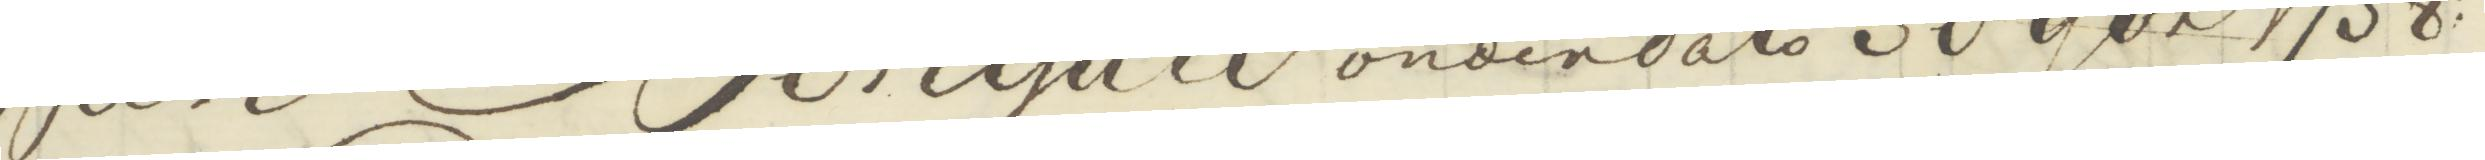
Van Bengale onderdato 30 gbr 1738:
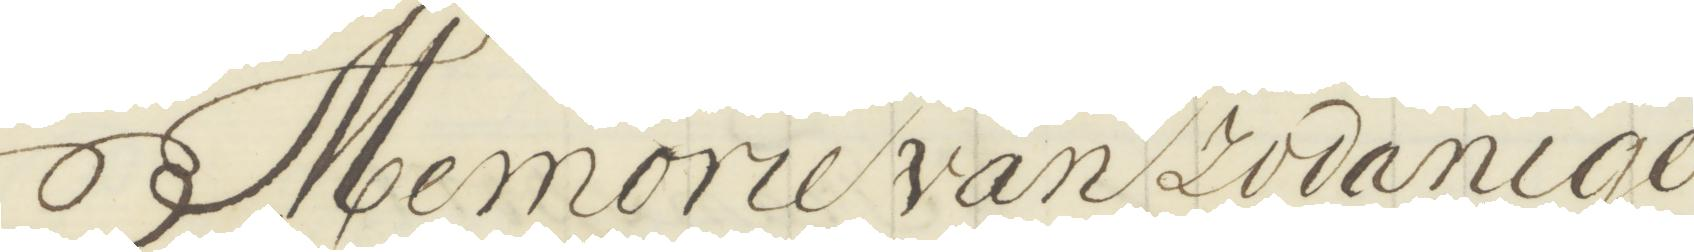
Memorie van zodanige
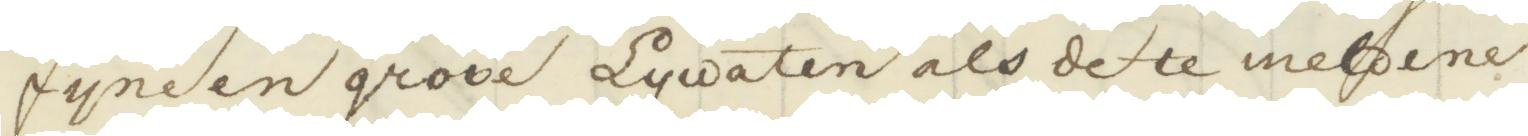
fijne en grove Lywaten als de te meldene
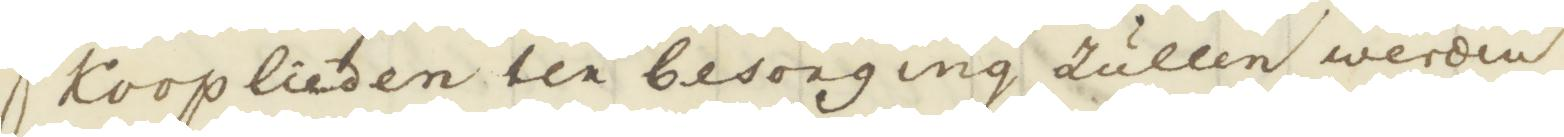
kooplieden ter besorging zullen werden
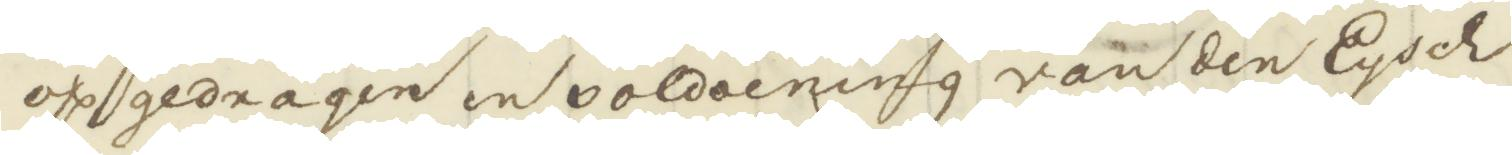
opgedragen in voldoening van den Eysch
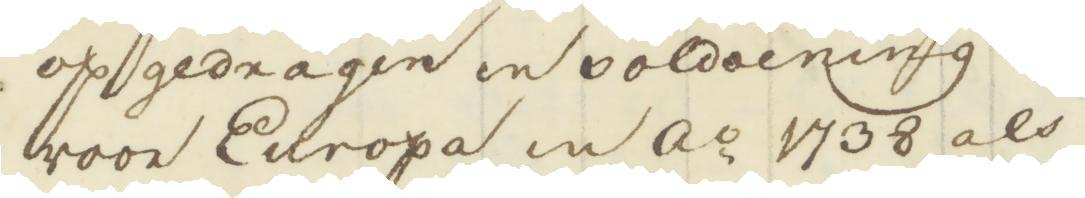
voor Europa in A„o 1738 als
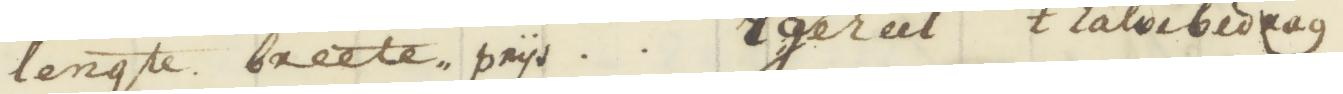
lengte breete,, prijs . . 't geheel t halve bedrag
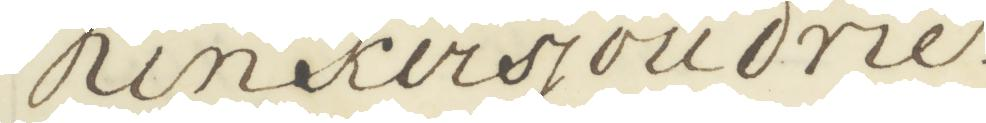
Kinkersjoudrie
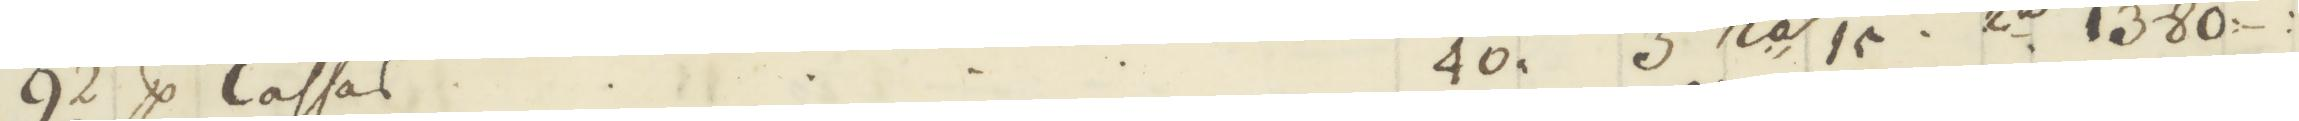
92 ps Cassas . . . . . . 40„ 3 r„a 15 . z-.w 1380:- :
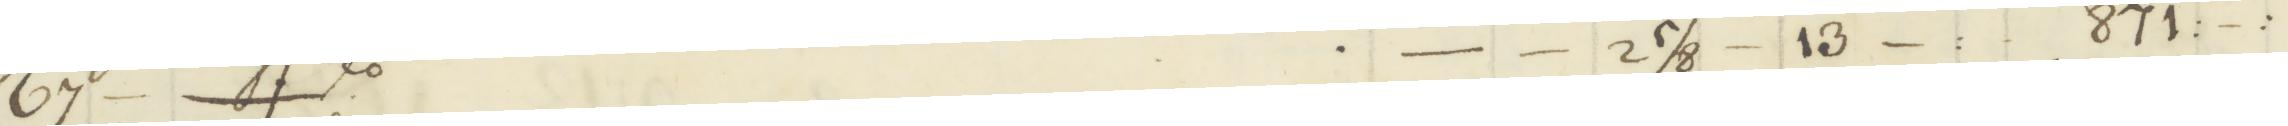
67 — _/o . . . — — 2 5/8 — 13 —: . 871: — :
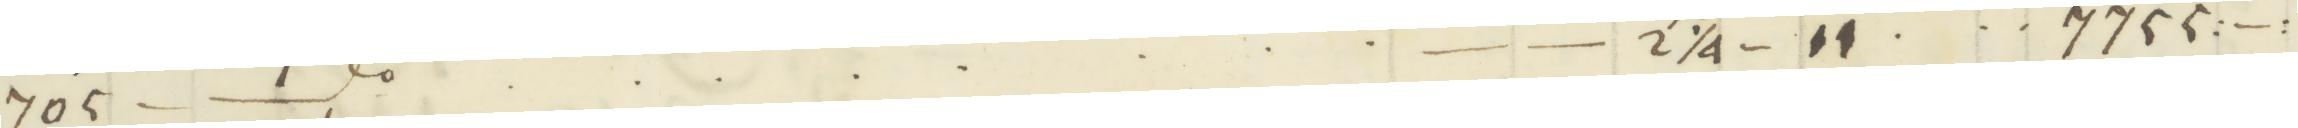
705 — _/o . . . . . . . . — — 2¼ — 11 . . . 7755: — :
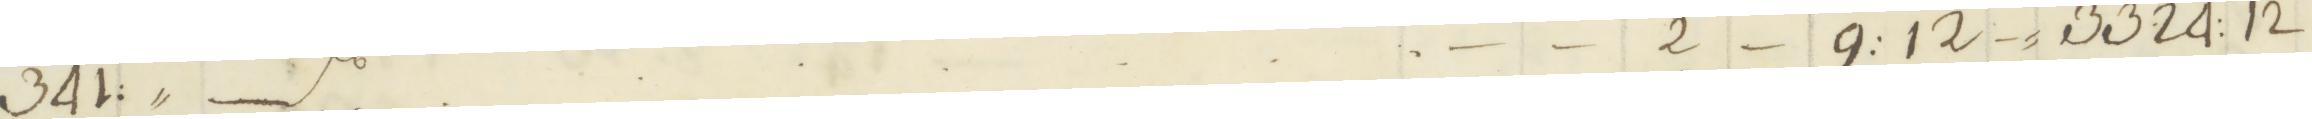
341: „ _/o . . . . . . . — — 2 — 9: 12 -„ 3324: 12
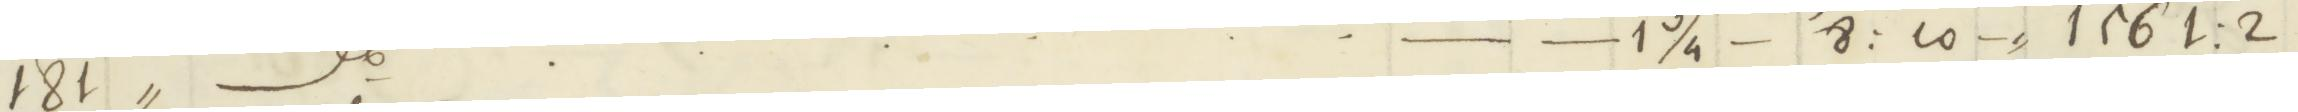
181 „ _/o . . . . . . — — 1¾ — 8: 10 -„ 1561:2
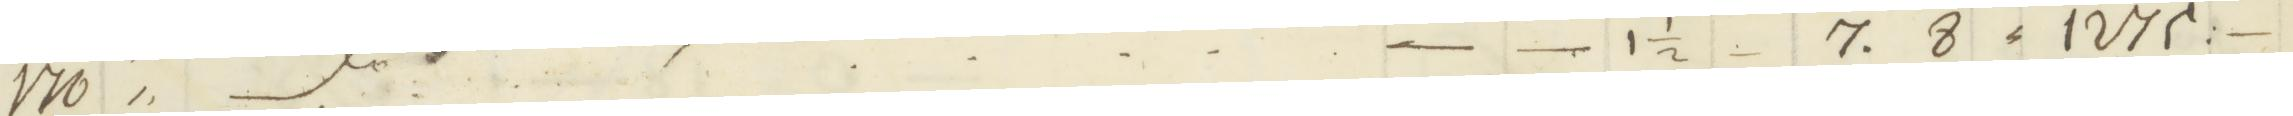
170 „ _/o . . . . . . — — 1½ — 7. 8 .„ 1275: —
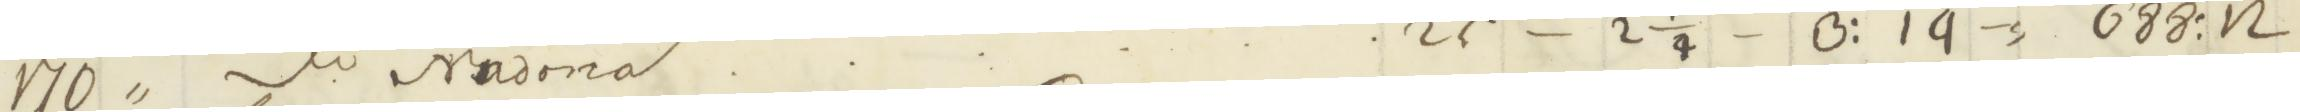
170 „ _/o Nadona . . . . . . 25 — 2¼ — 3: 14 -„ 688:12
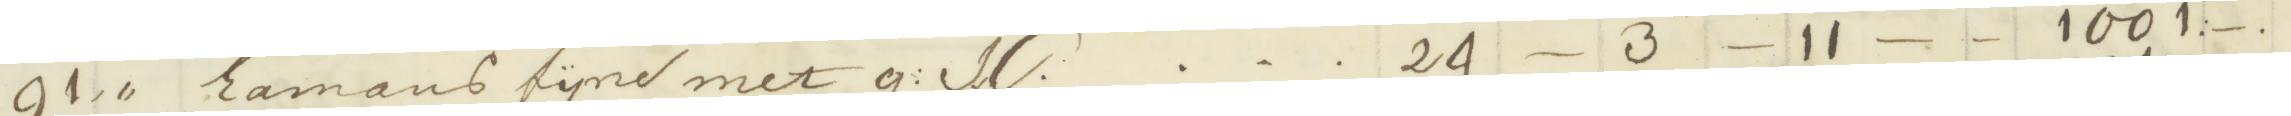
91 „ hamans fijne met g: H . . . 24 — 3 — 11 — — 1001:— .
